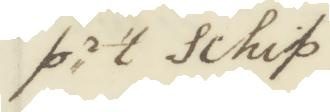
p„r ’t schip
